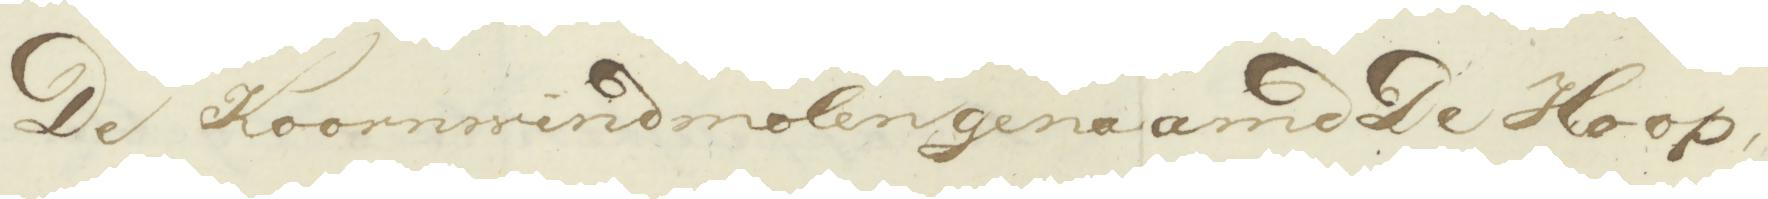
De Koornwindmolen genaamd de Hoop,
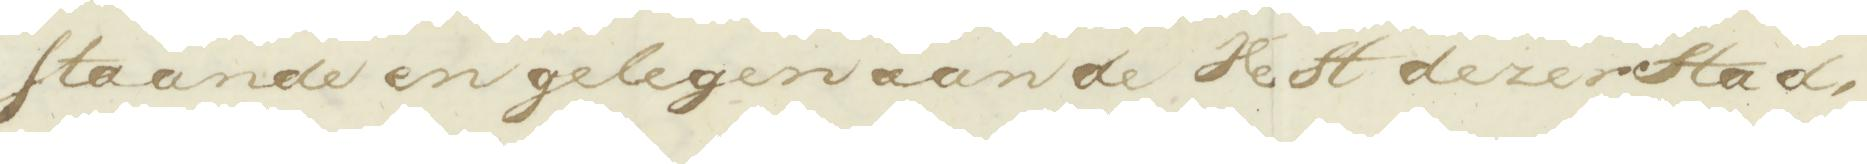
staande en gelegen aan de Vest dezer stad,
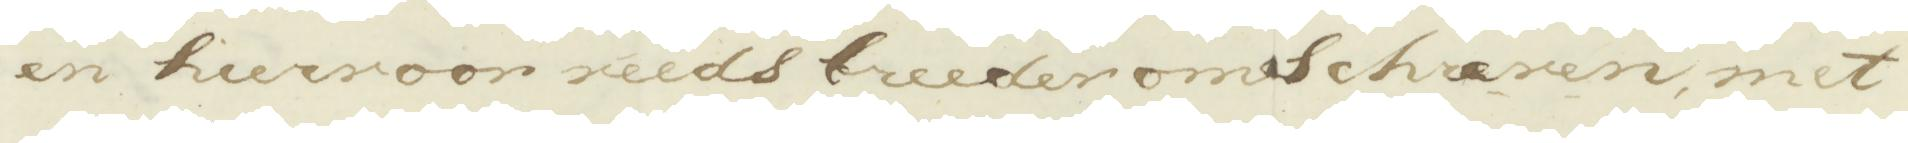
en hiervoor reeds breeder omschreven, met
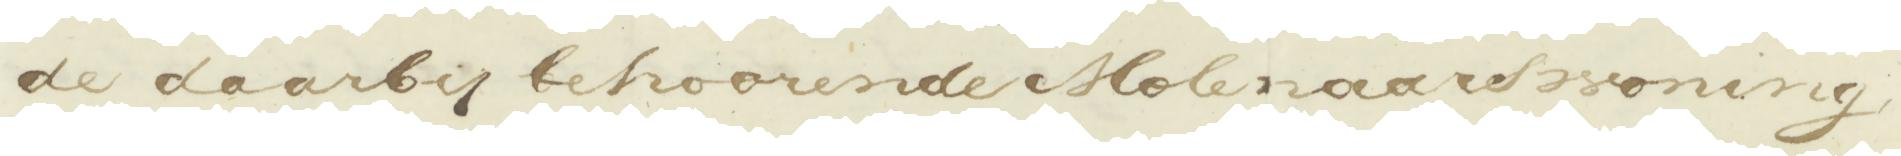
de daarbij behoorende Molenaarswoning,
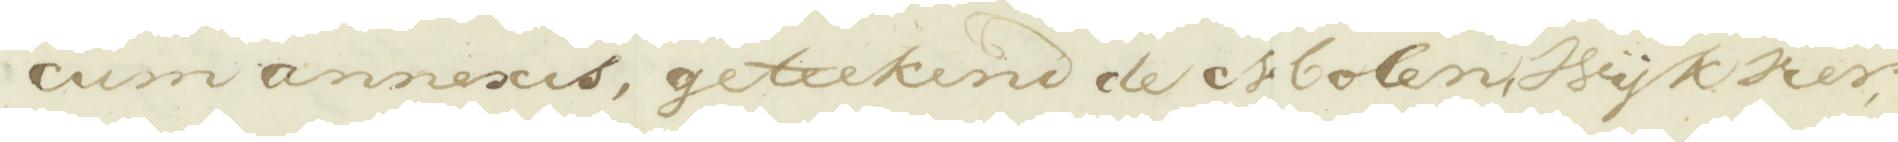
cum annexis, geteekend de Molen, Wijk vier,
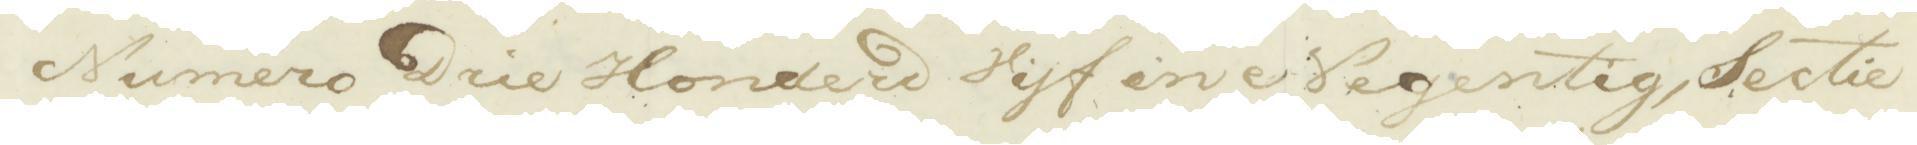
Numero Drie Honderd Vijf en Negentig, sectie
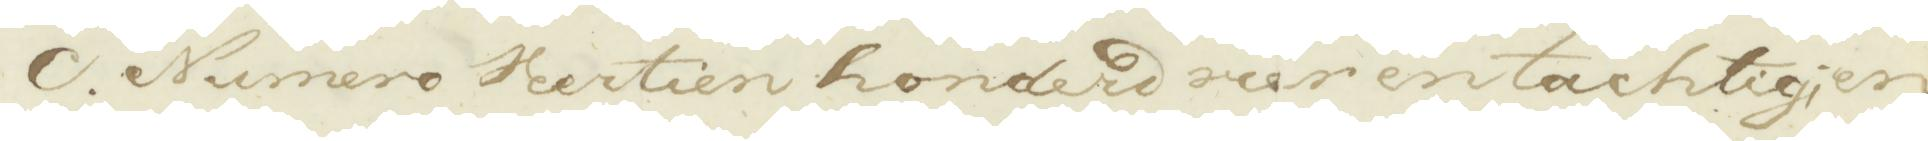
C. Numero Veertien honderd vier en tachtig, en
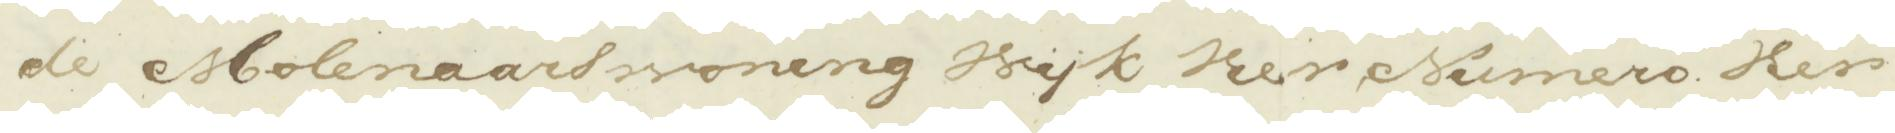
de Molenaarswoning wijk vier, Numero Vier
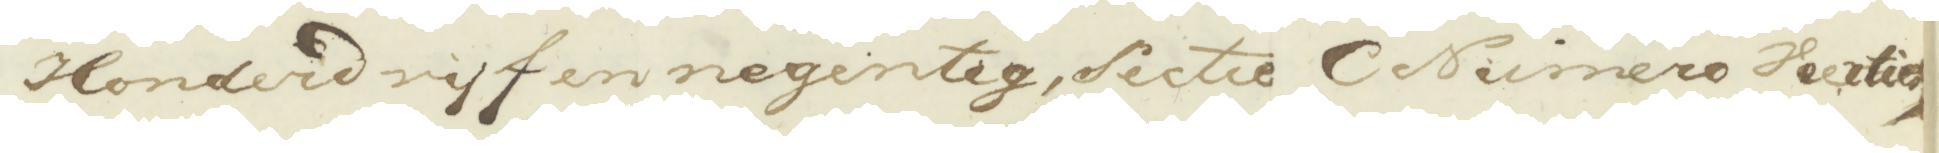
Honderd vijf en negentig, sectie C Numero Veertig
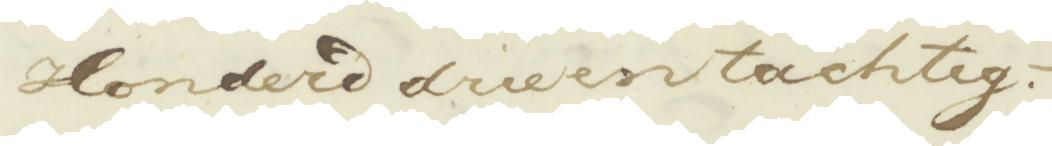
Honderd drie en tachtig.
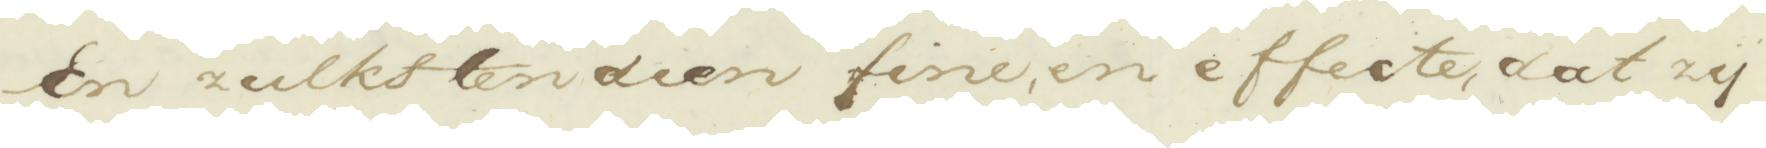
En zulks ten dien fine, en effecte, dat zij
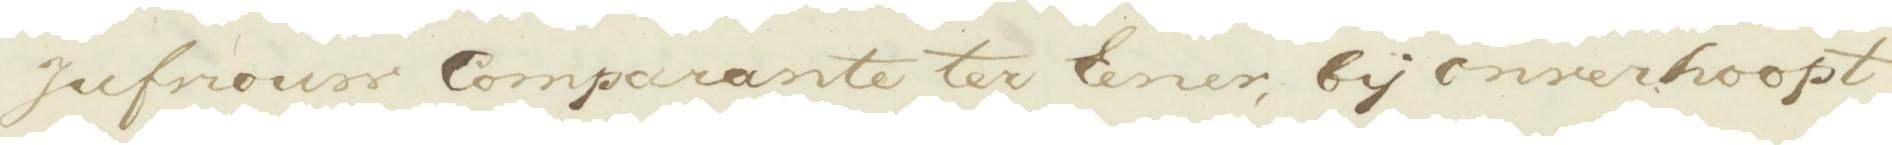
Jufvrouw Comparante ter Eener, bij onverhoopt
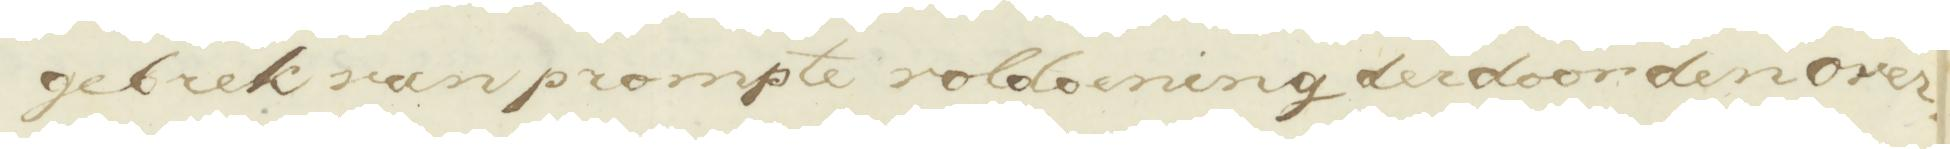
gebrek van prompte voldoening der door den over,
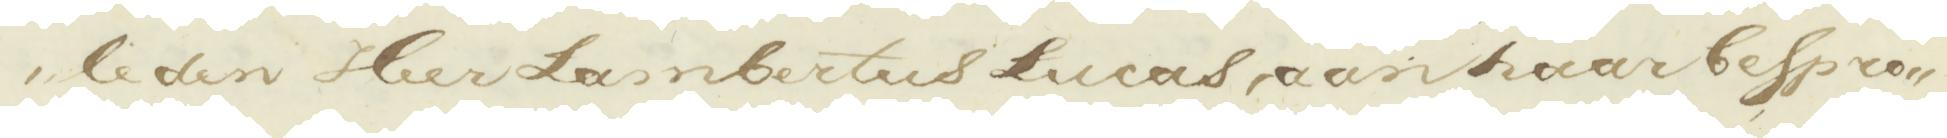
„leden Heer Lambertus Lucas, aan haar bespro„
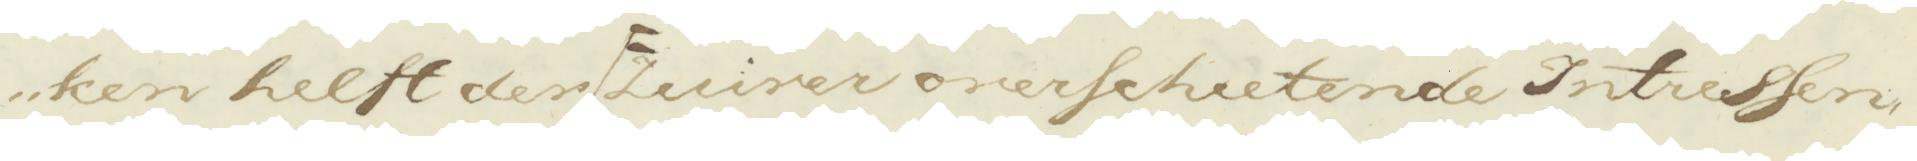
„ken helft der Zuiver overschietende Intressen,
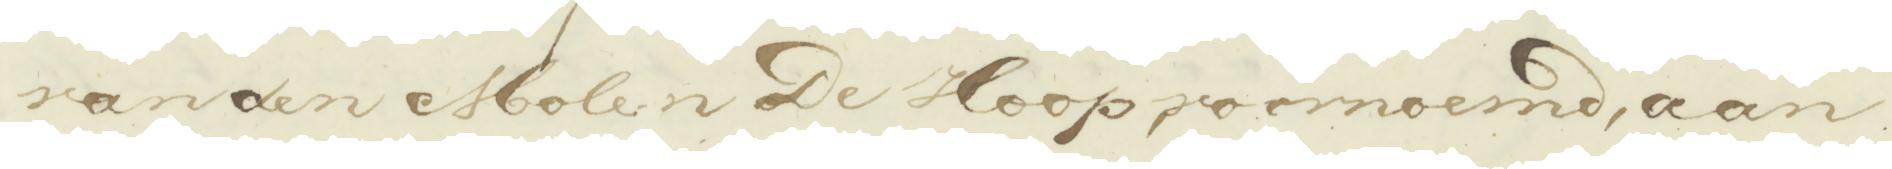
van den Molen De Hoop, voornoemd, aan
